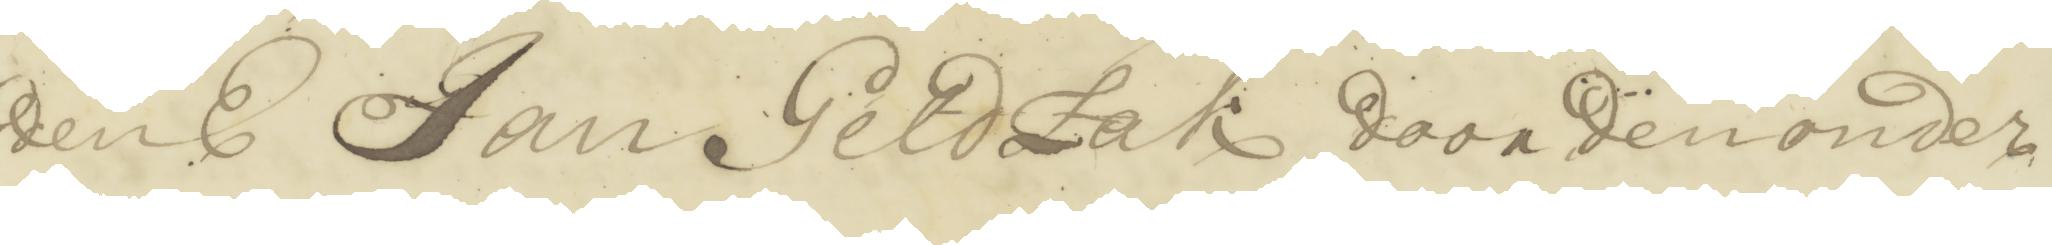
den E Ian Geldzak door den onder
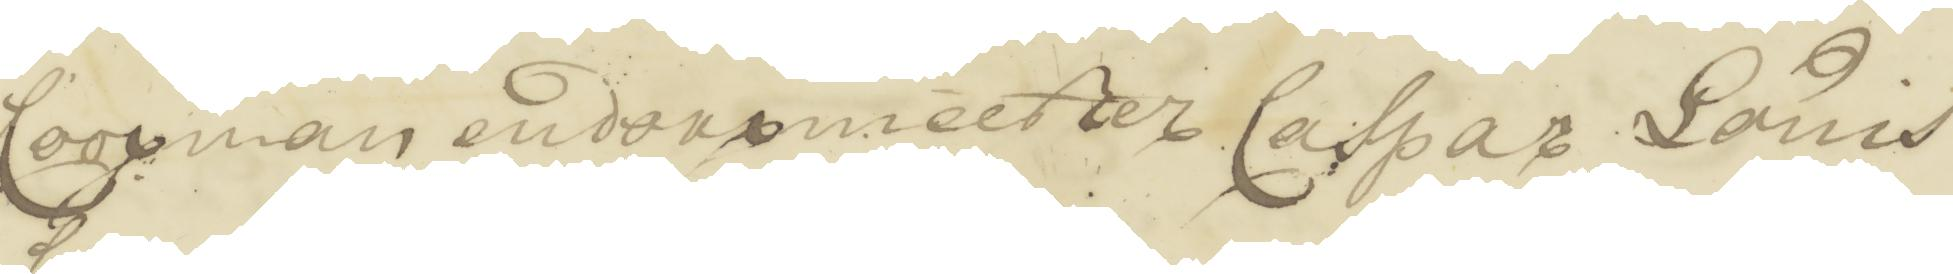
Coopman en dorpmeester Caspar Louis
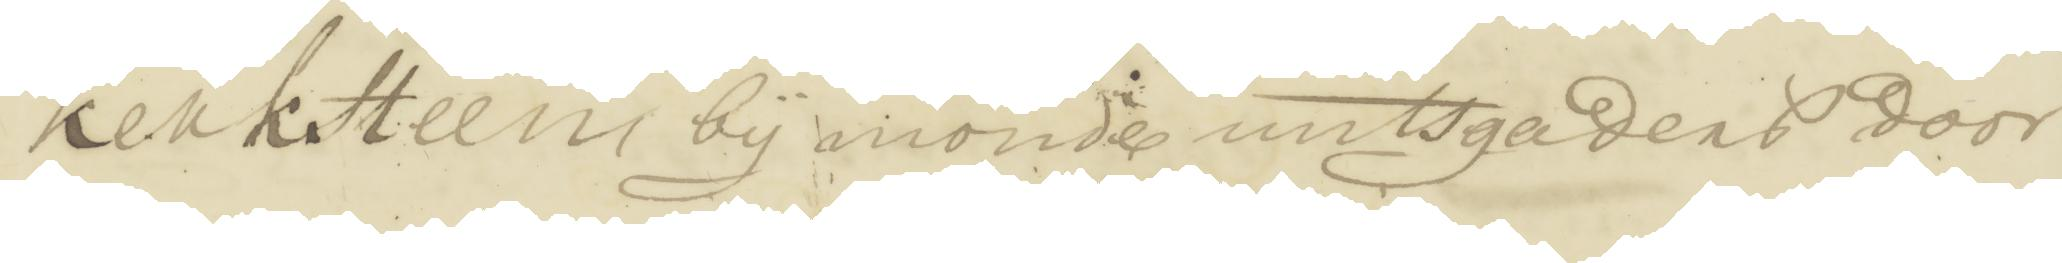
kerksteen, bij monde mitsgaders door
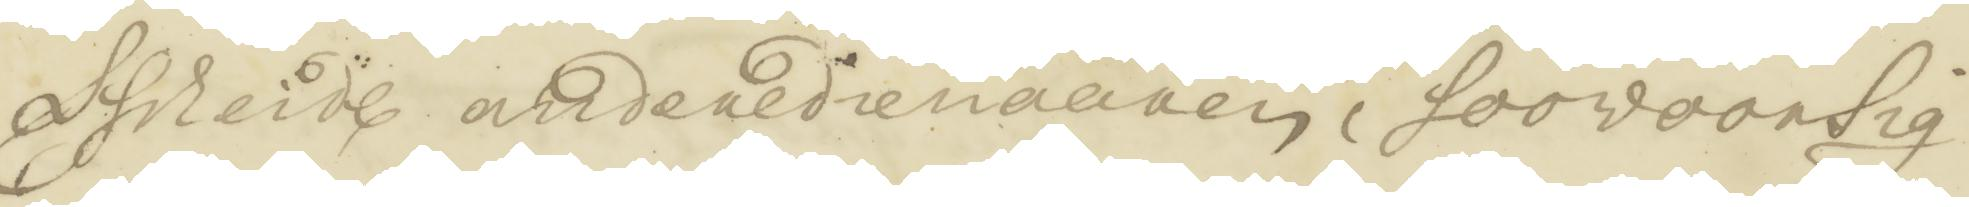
verscheide andere die naaren, soo voorsig
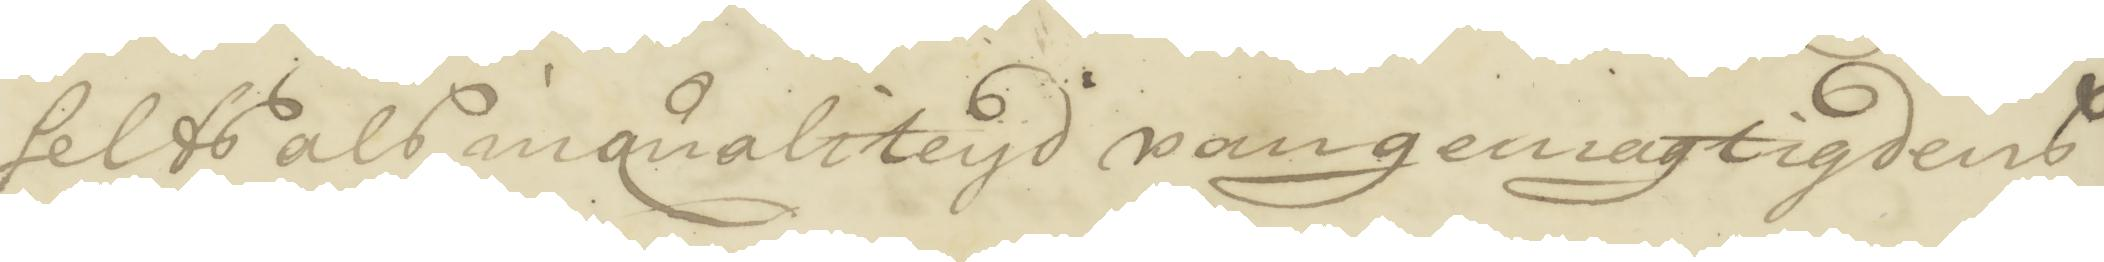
selfs als inqualiteijd van gemagtigdens
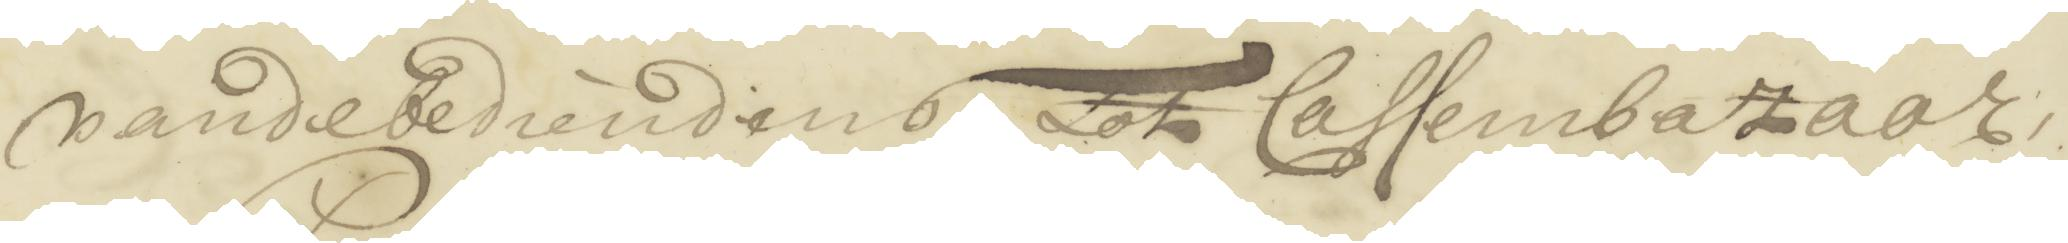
van de bediendens tot Cassembazaar,
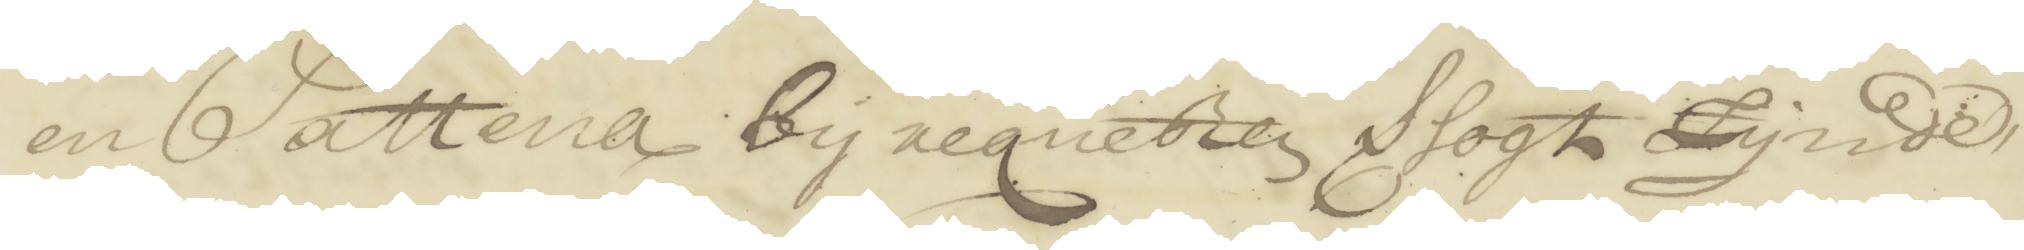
en Pattena bij requesten versogt zijnde,
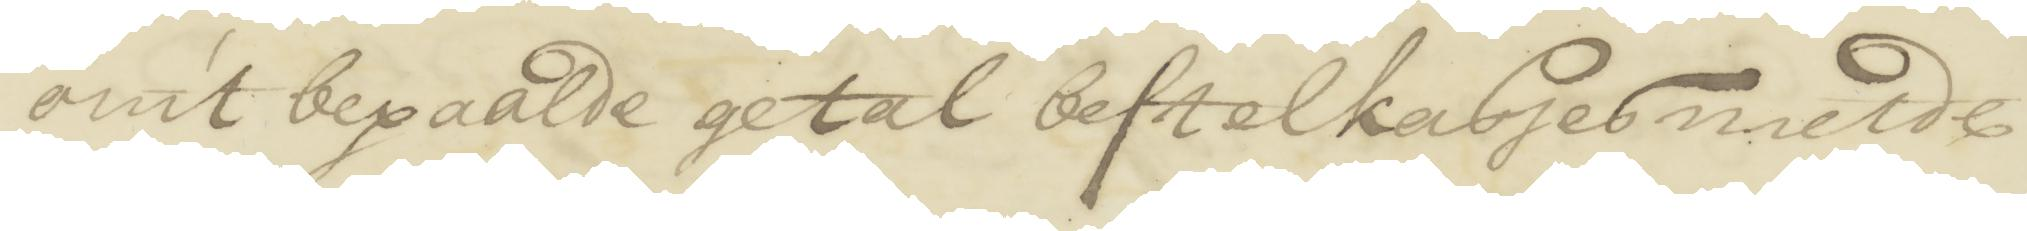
om't bepaalde getal bestelkasjes met de
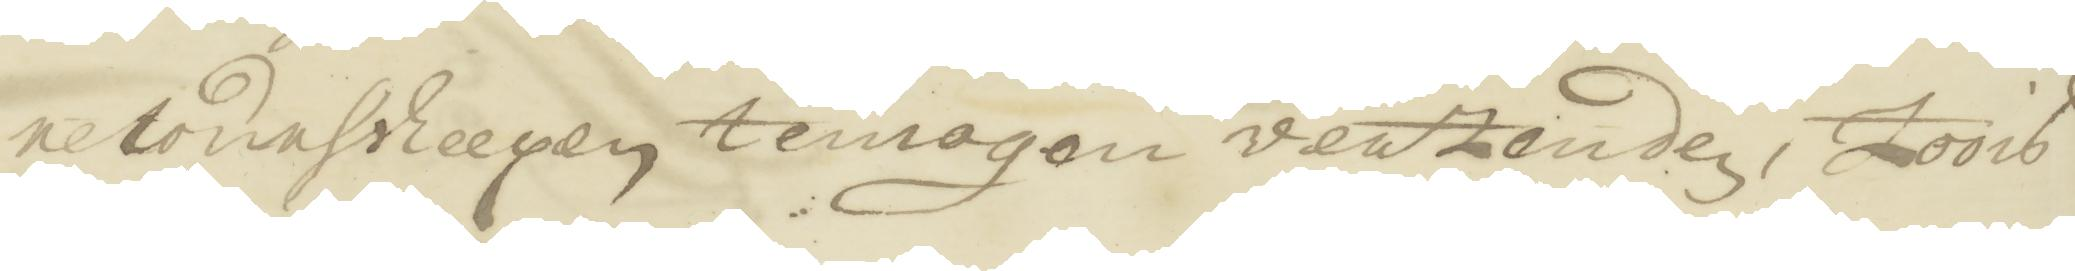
retourscheepen temogen verzenden, zoois
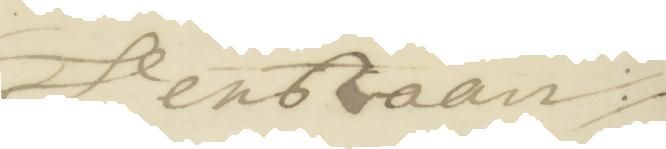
Verstaan:
